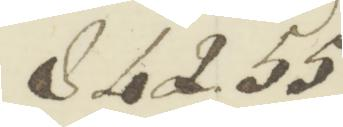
842.55
